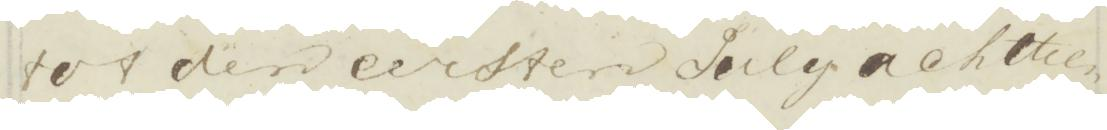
tot den eersten July achttien
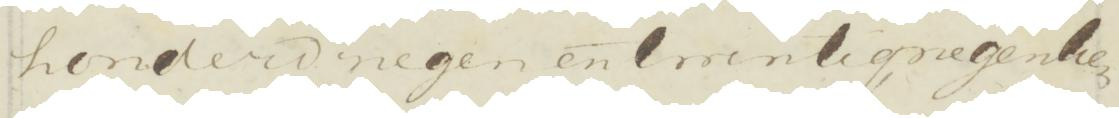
honderd negen en twintig, negentien
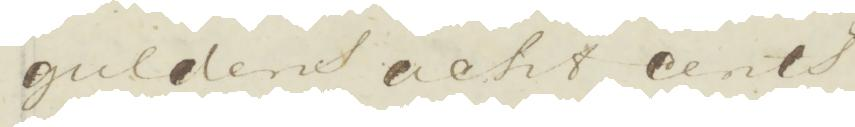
guldens acht cents – —
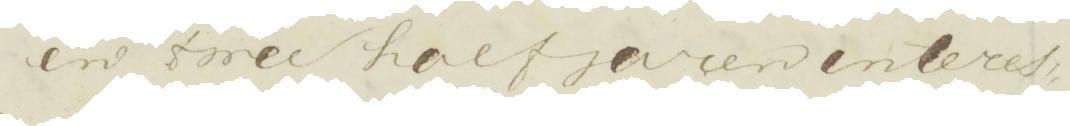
en twee halfjaren interes„
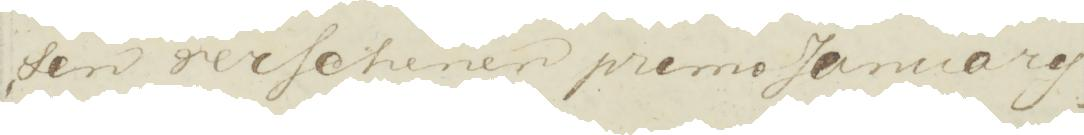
,sen verschenen primo January
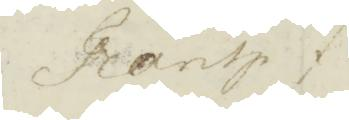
Transp ƒ
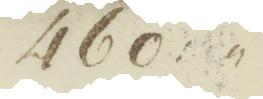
460: „
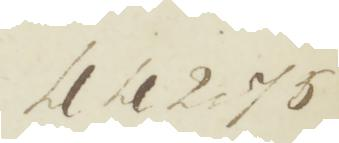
442:75
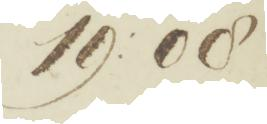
19: 08
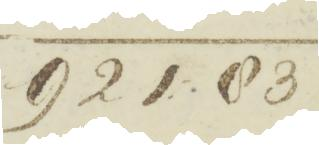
921: 83
